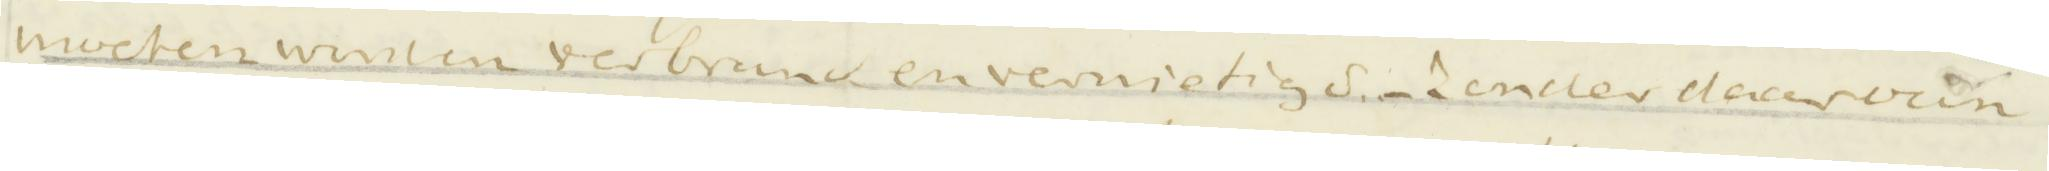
moeten worden verbrand en vernietigd. – zonder daarvan
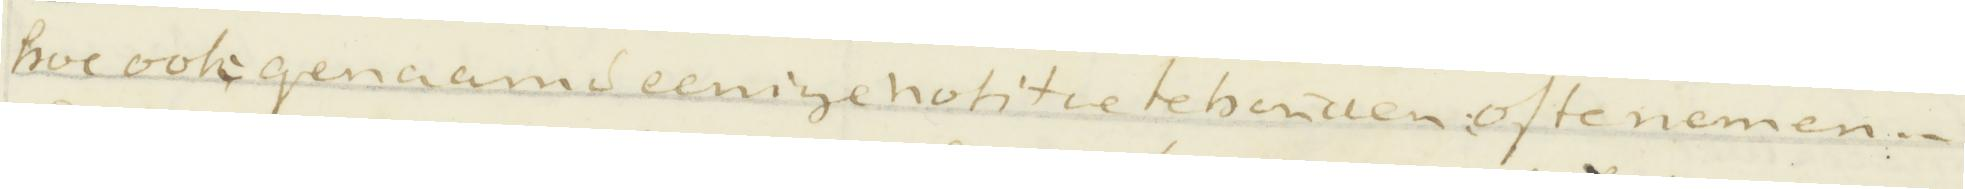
hoe ook genaamd eenige notitie te houden, of te nemen. –
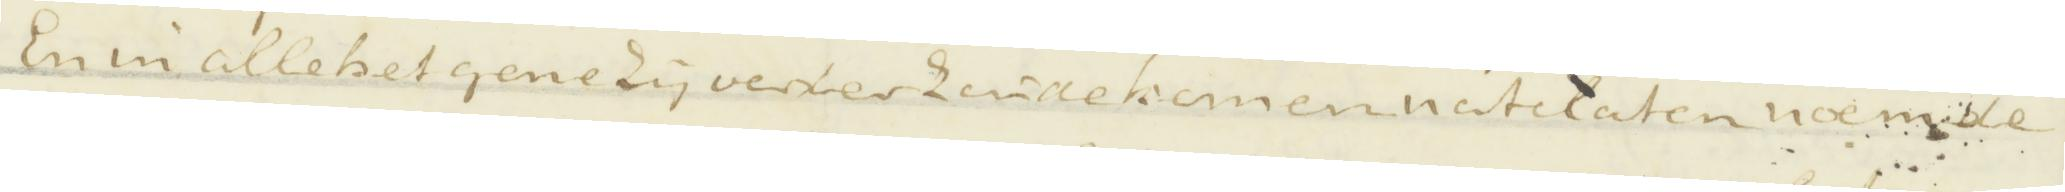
En in alle het gene zij verder zoude komen natelaten noemde
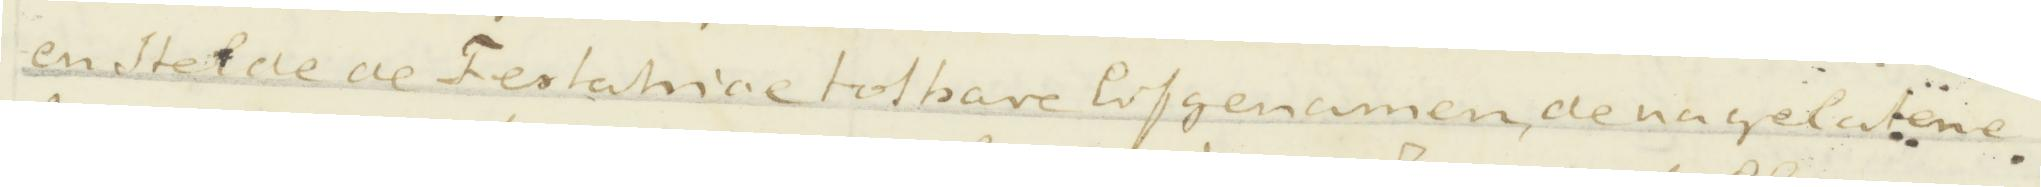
en stelde de Testatrice tot hare Erfgenamen de nagelatene
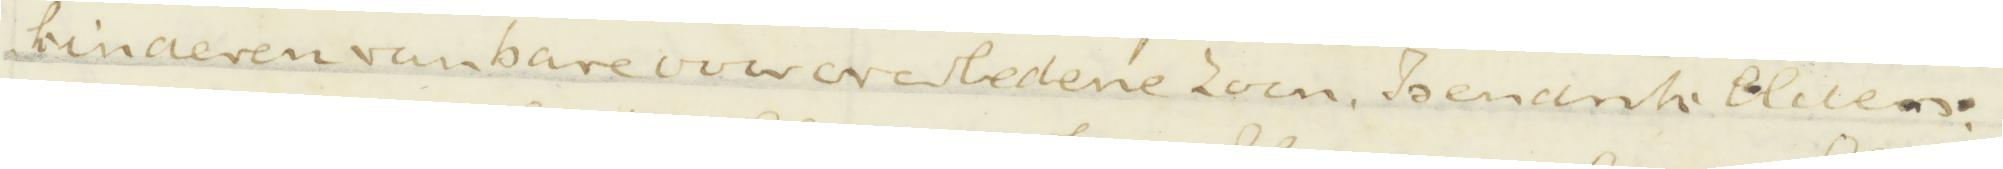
kinderen van hare voor overledene zoon, Hendrik Elders
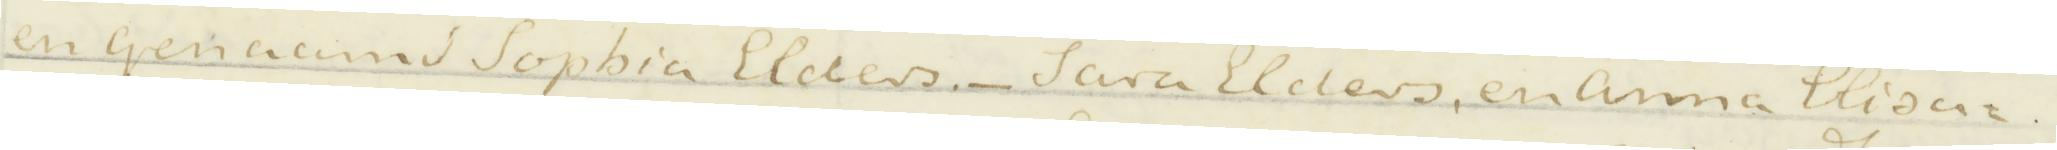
en genaamd Sophia Elders. – Sara Elders, en Anna Elisa=
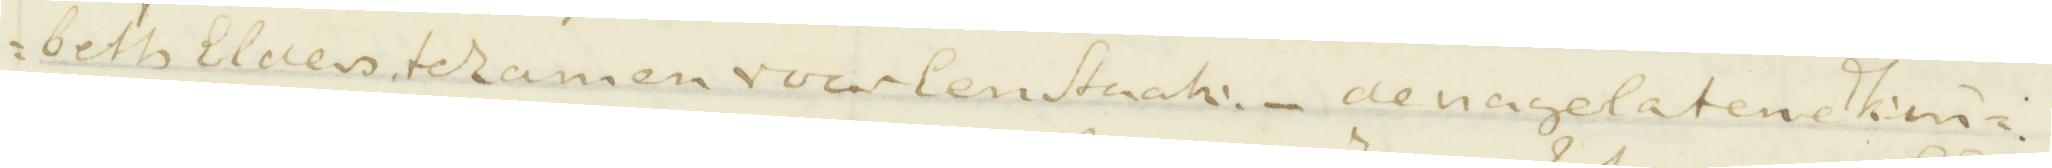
=beth Elders, tezamen voor Een staak. – de nagelatene kin=
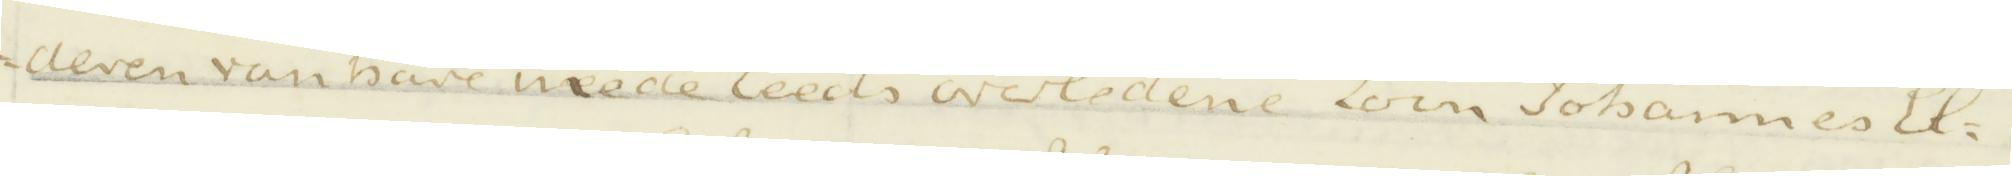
=deren van hare mede reeds overledene zoon Johannes El=
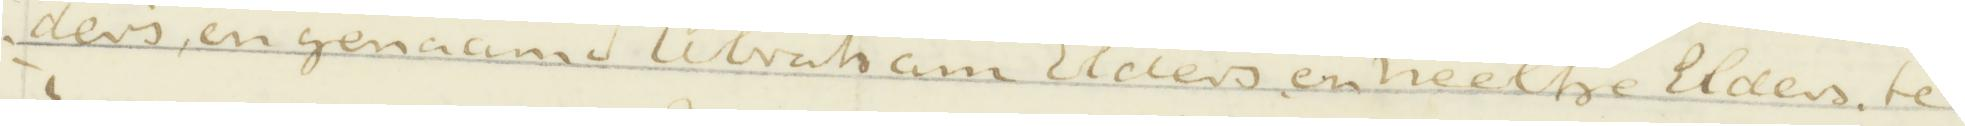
=ders, en genaamd Abraham Elders en neeltje Elders, te
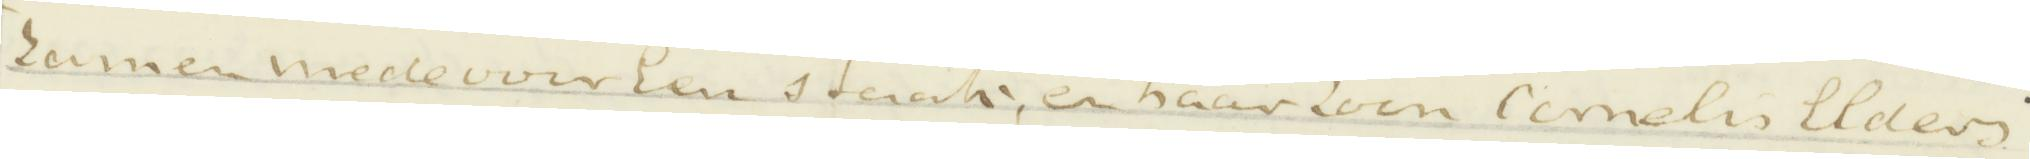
zamen mede voor Een staak, en haar zoon Cornelis Elders
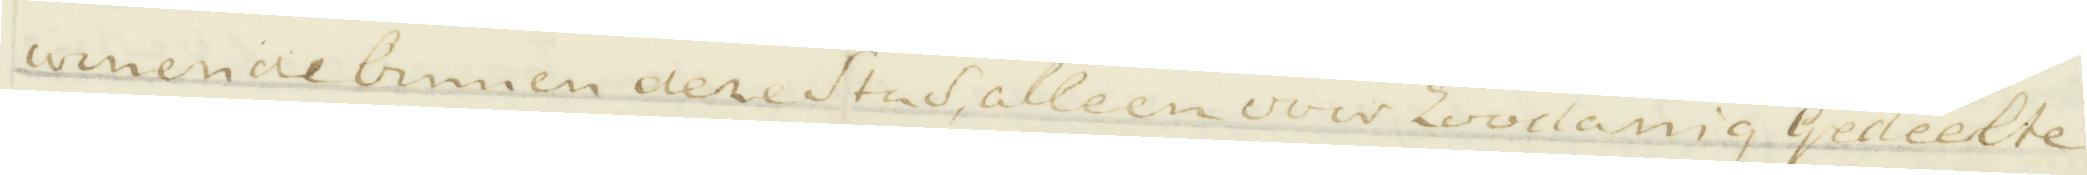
wonende binnen deze stad, alle en voor zoodanig Gedeelte
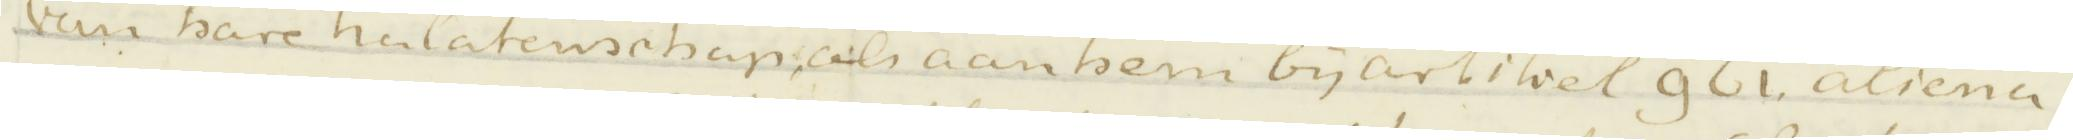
van hare nalatenschap, als aan hem bij artikel 961 aliena
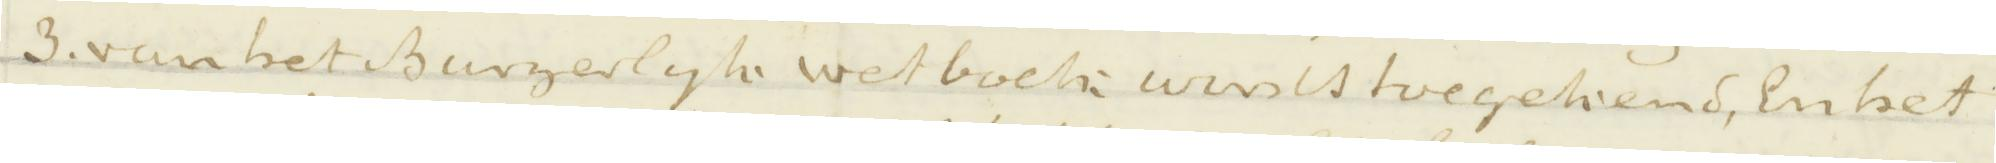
3. van het Burgerlyk wetboek wordt toegekend, En het
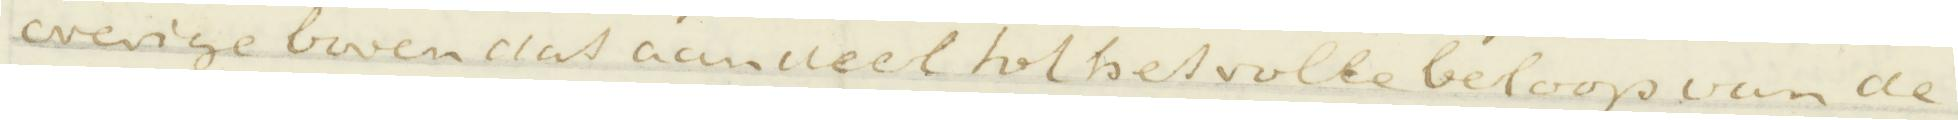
overige boven dat aandeel tot het volle beloop van de
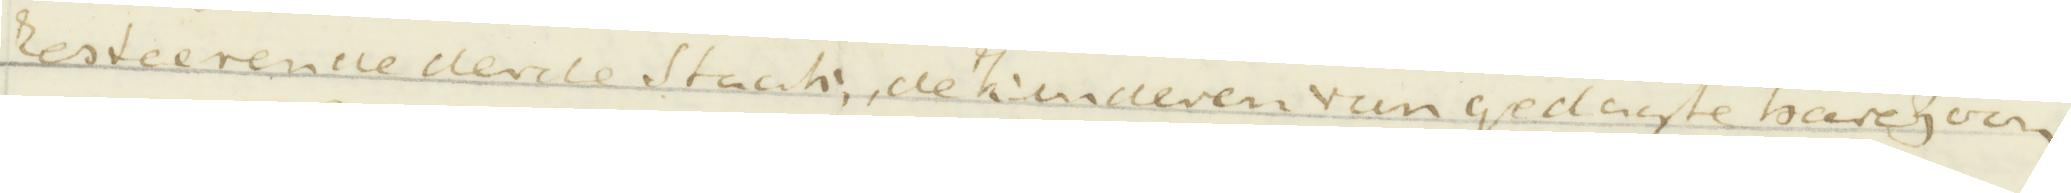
resteerende derde staak, de kinderen van gedagte hare Zoon
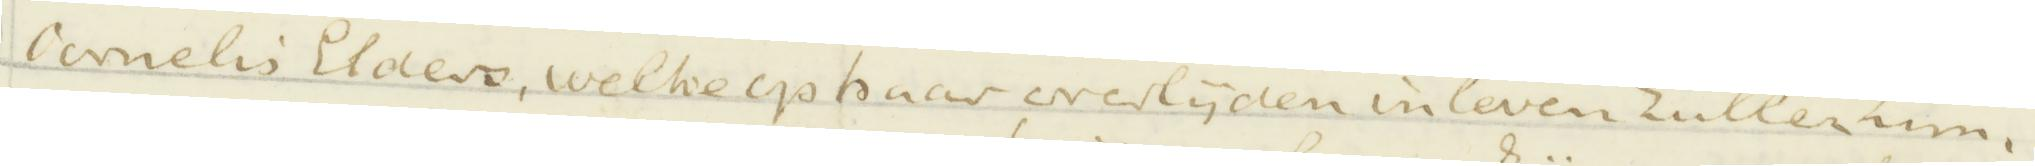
cornelis Elders, welke op haar overlyden in leven zullen zyn,
